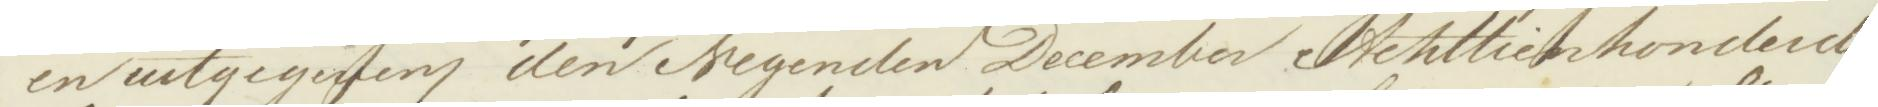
en uitgegeven, den Negenden December Achttienhonderd
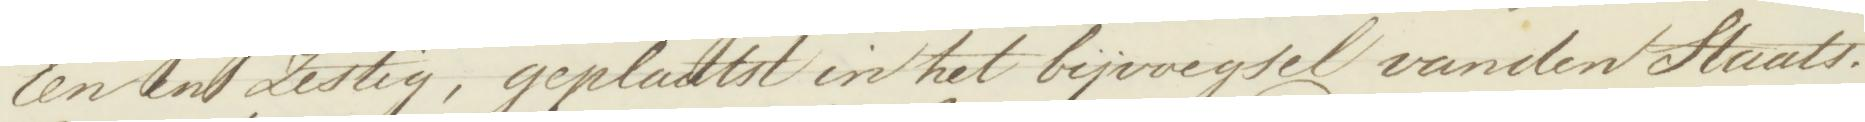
Een en zestig, geplaatst in het bijvoegsel vanden Staats.
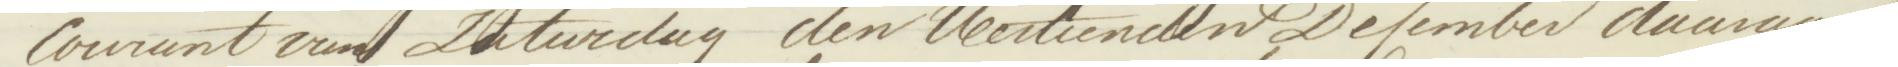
Courant van Zaturdag den Veertienden December daaraan.
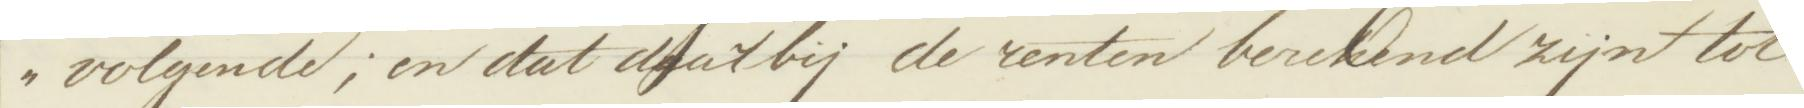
„volgende; en dat daar bij de renten berekend zijn tot
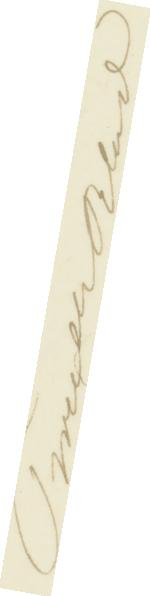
Tweedeblad
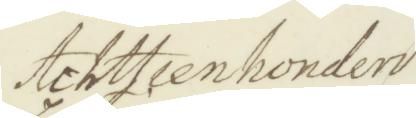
Achttienhonderd
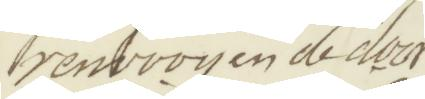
renvooij en de door
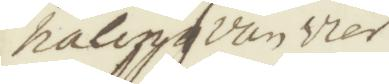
haling van vier
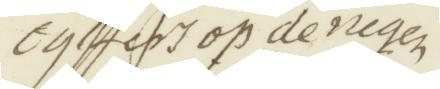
cyffers op de negen
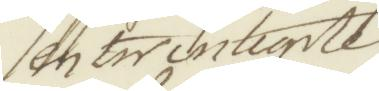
en twintigste
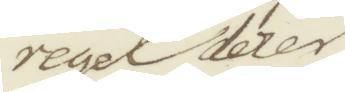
regel dezer
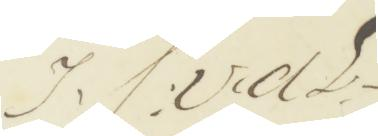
J C:v.dL
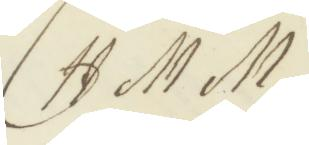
H M M.
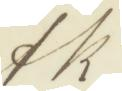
Ak
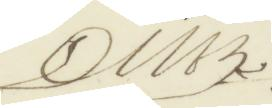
OMB
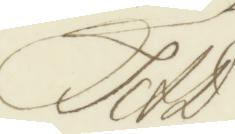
IctD
